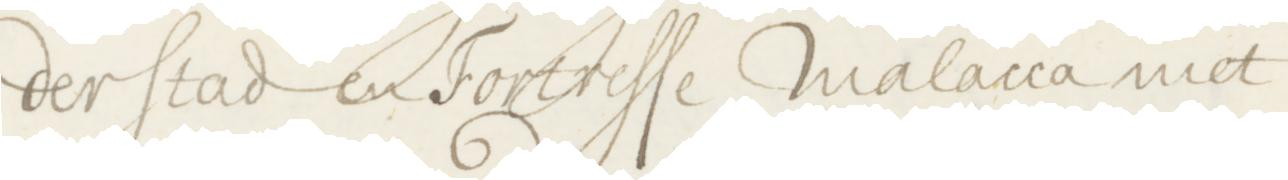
der stad en Fortresse malacca met
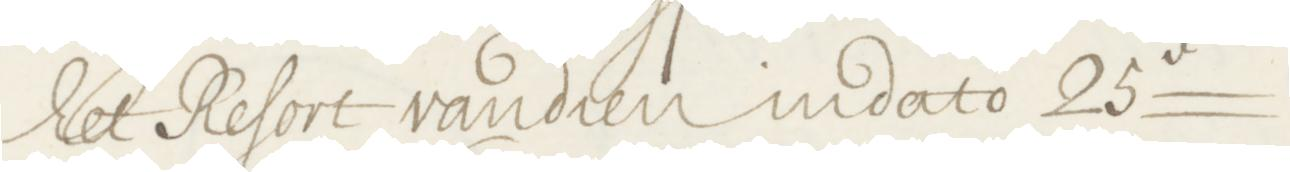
het Resort vandien indato 25=e
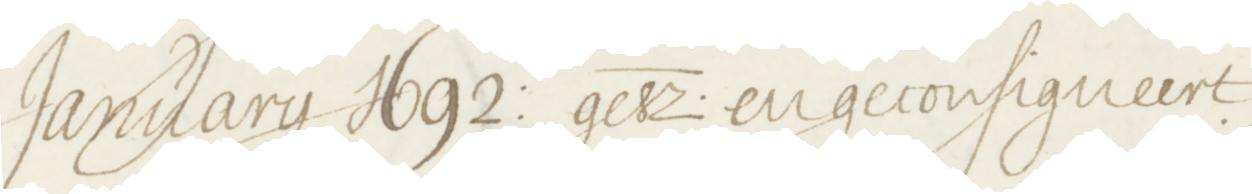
January 1692: gesz: en geconsigneert
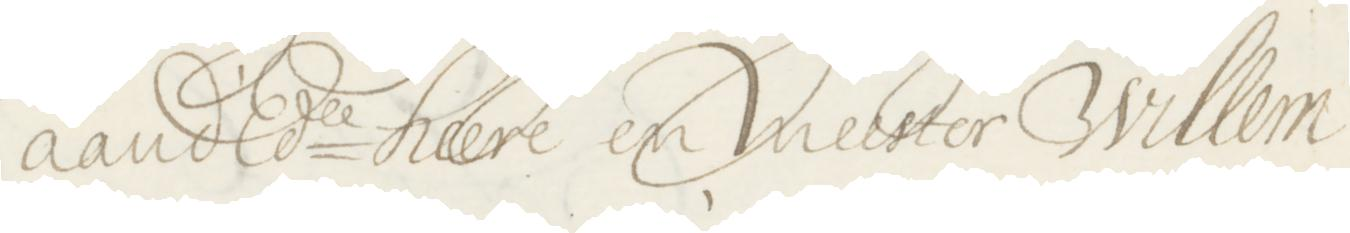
aan d' Ed=le heere en meester Willem
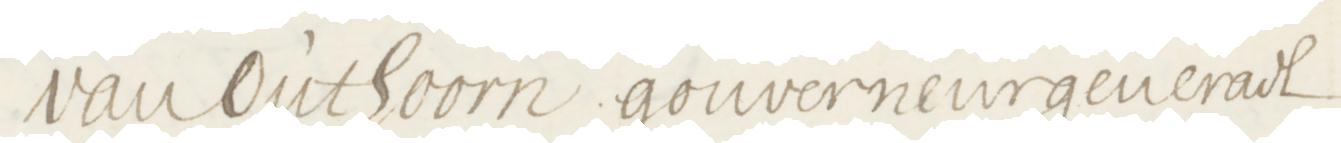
van Outhoorn gouverneurgenerael
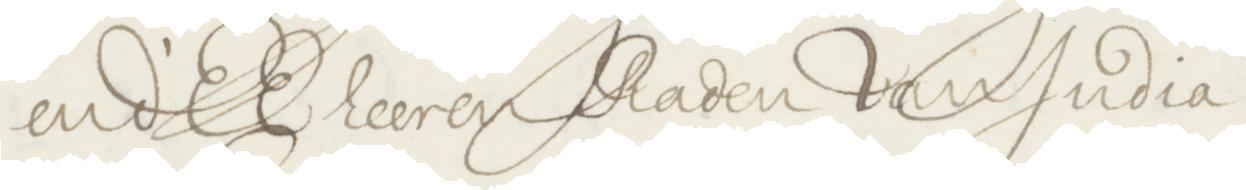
en d' EE heeren Raden van Jndia
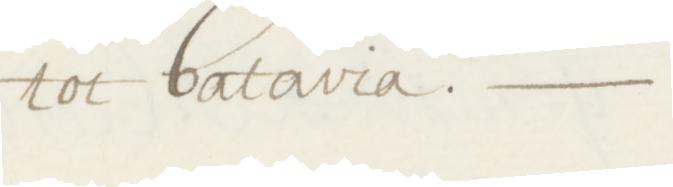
tot batavia. —
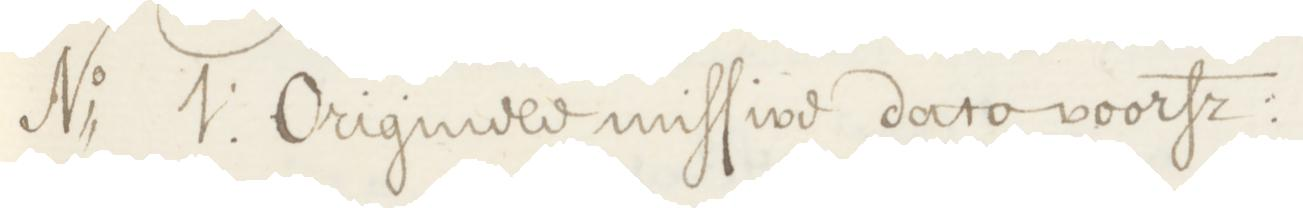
N„o 1: Originele missive dato voorsz:
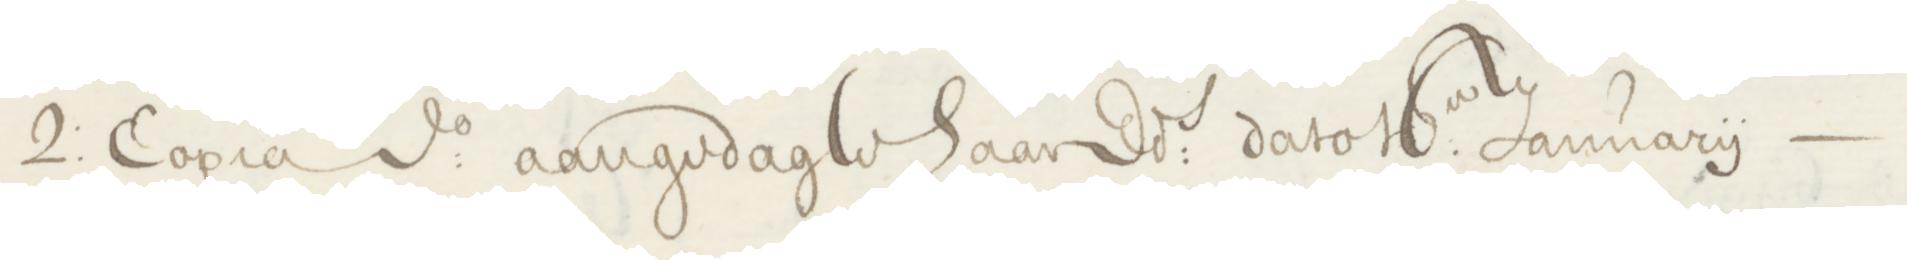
2: Copia d:o aangedagte haar Ed:s dato 16:e Januarij —
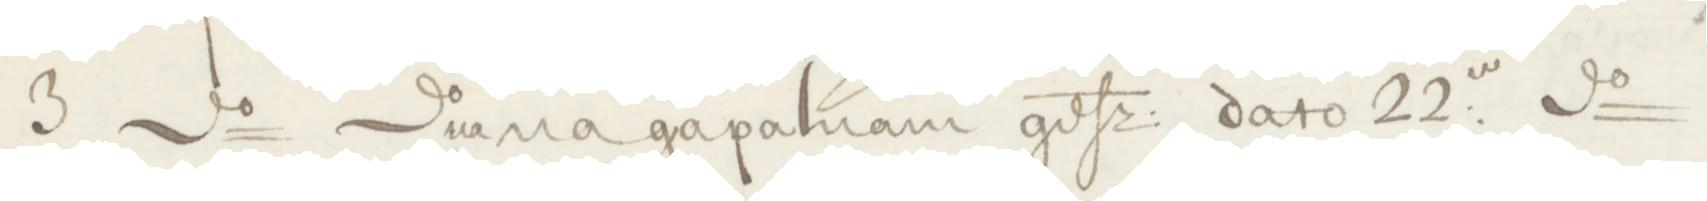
3 d=o d=o na gapatnam gesz: dato 22:e d=o
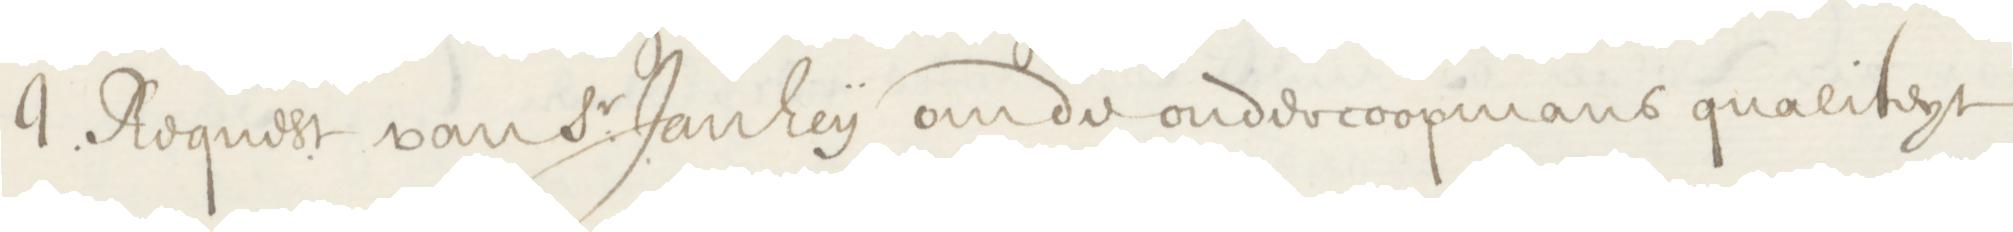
4. Request van s:r Janheij om de ondercoopmans qualiteyt
